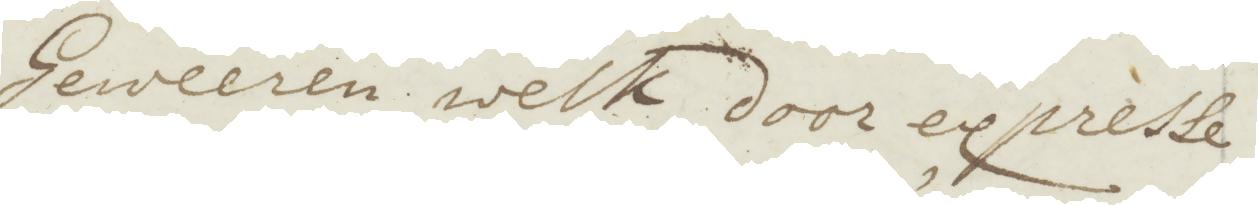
geweeren. welk door expresse
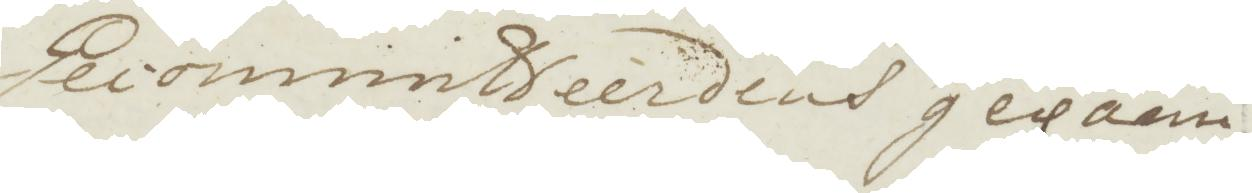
Gecommitteerdens g'exami
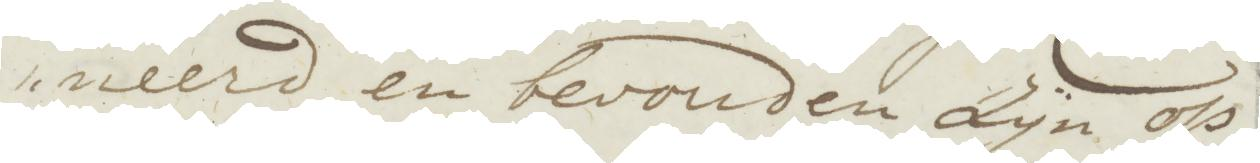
„neerd en bevonden zijn op,
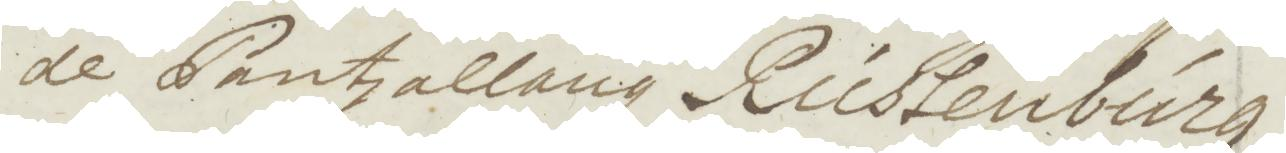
de Pantjallang Rustenburg
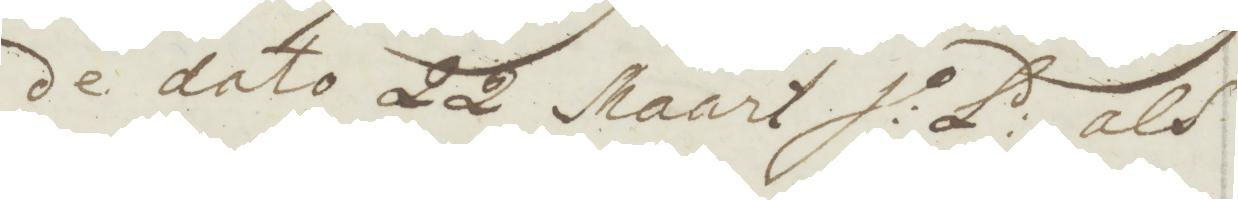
de dato 22 Maart J:o L:d: als
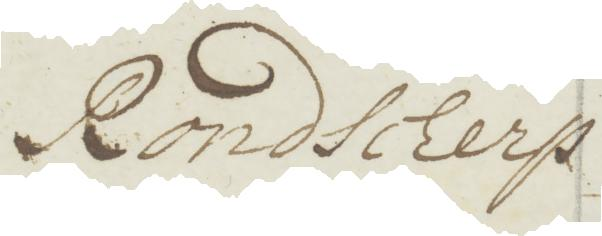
Rondscherp
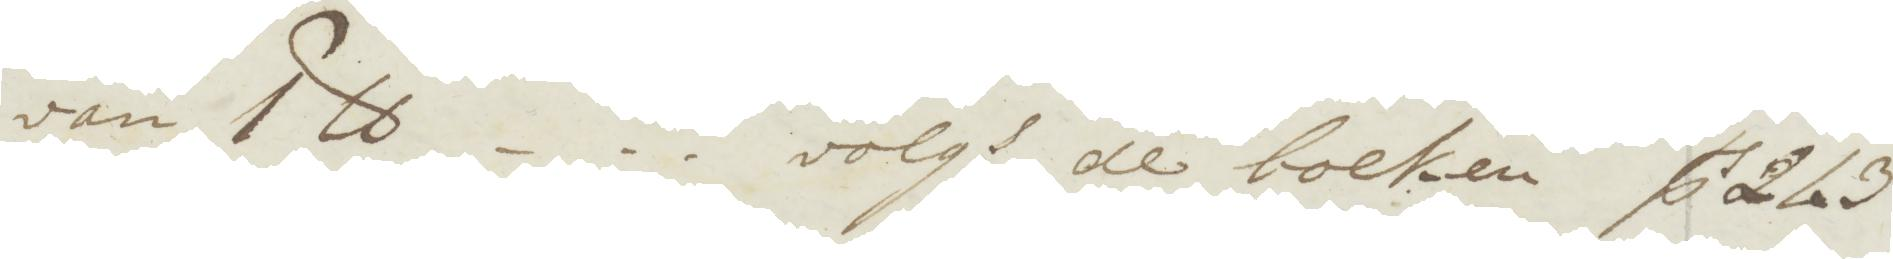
van 1 lb - - - volg.s de boeken ps 213
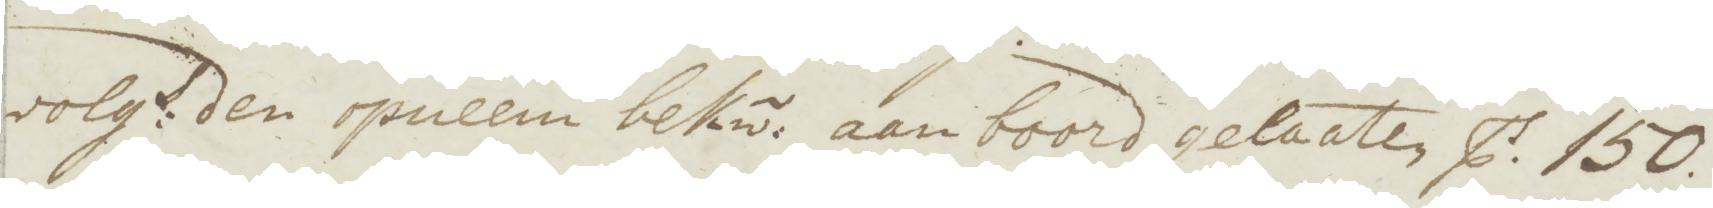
volg:s den opneem bekw: aan boord gelaaten p.s 150.
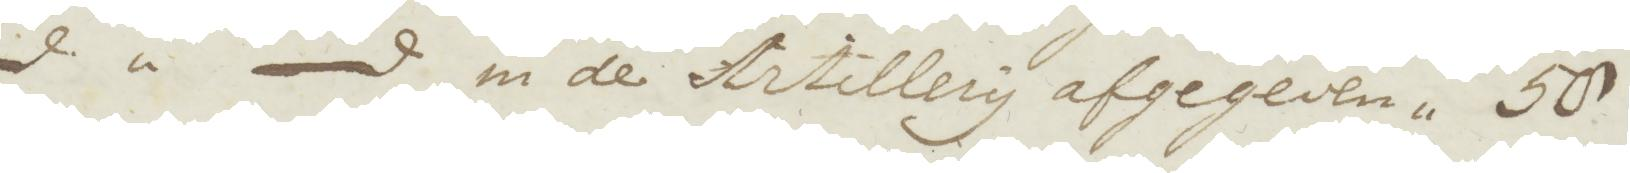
_o. „ _o in de Artillerij afgegeven „ 58
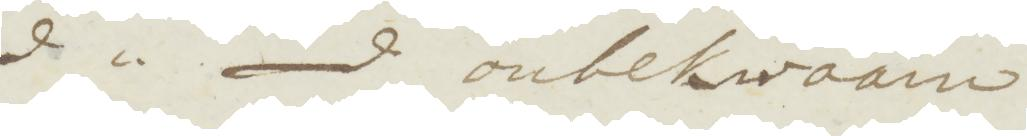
_o „ _o onbekwaam
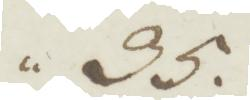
„ 35.
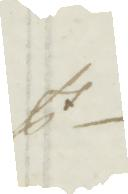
ps
